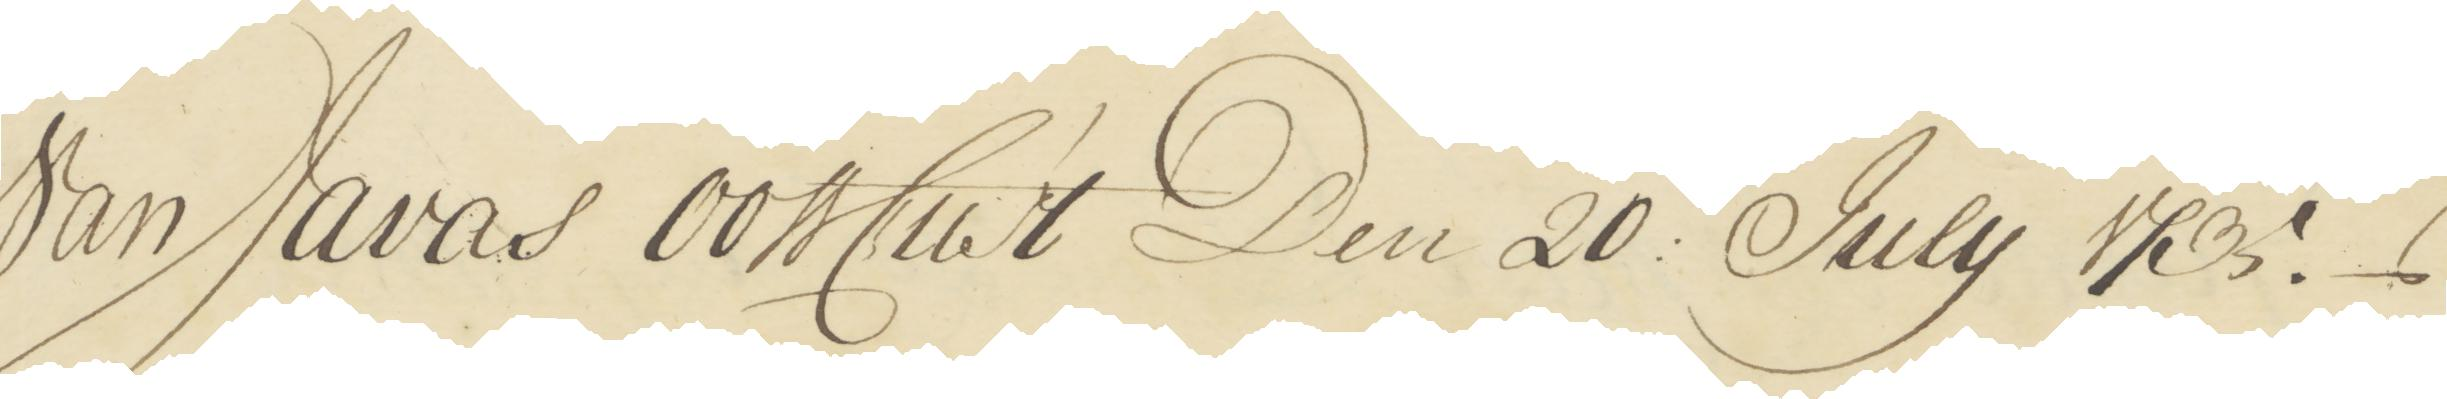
Van Javas oostCust Den 20:' Julij 1735. —
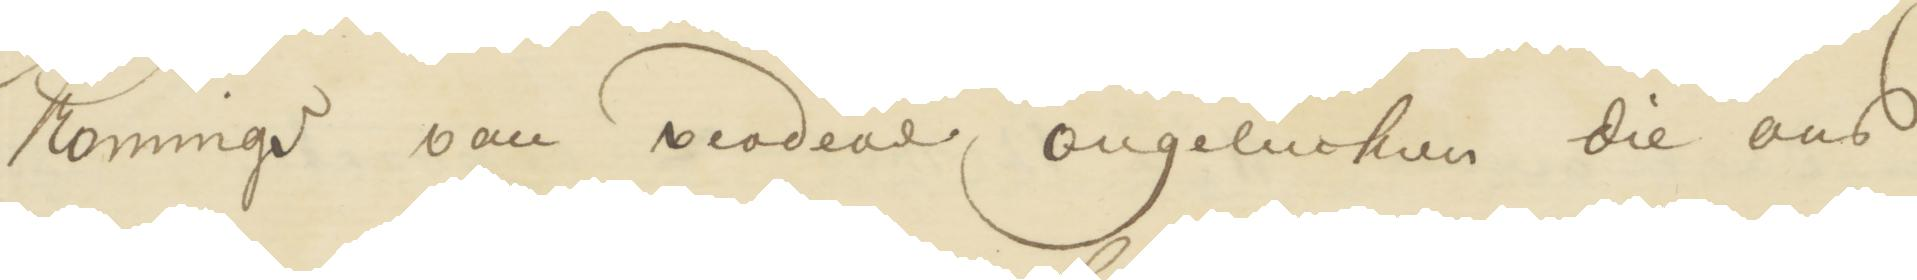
kominge van verdere ongelucken die ons
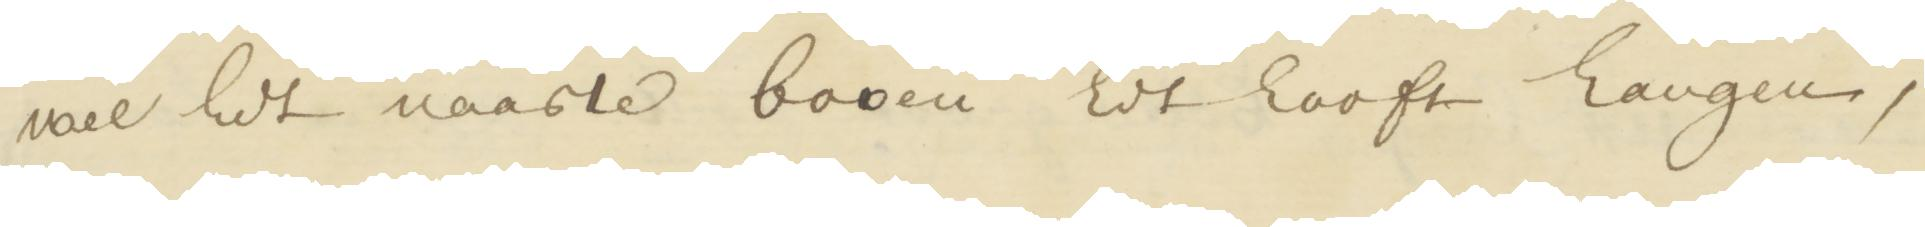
wel het naaste boven het hooft hangen,
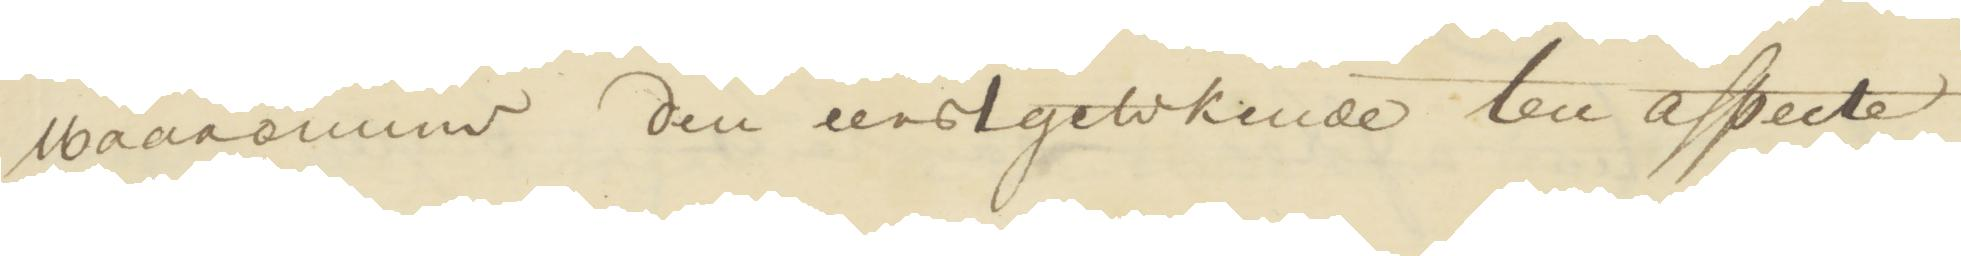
waaromme den eerstgetekende ten aspecte
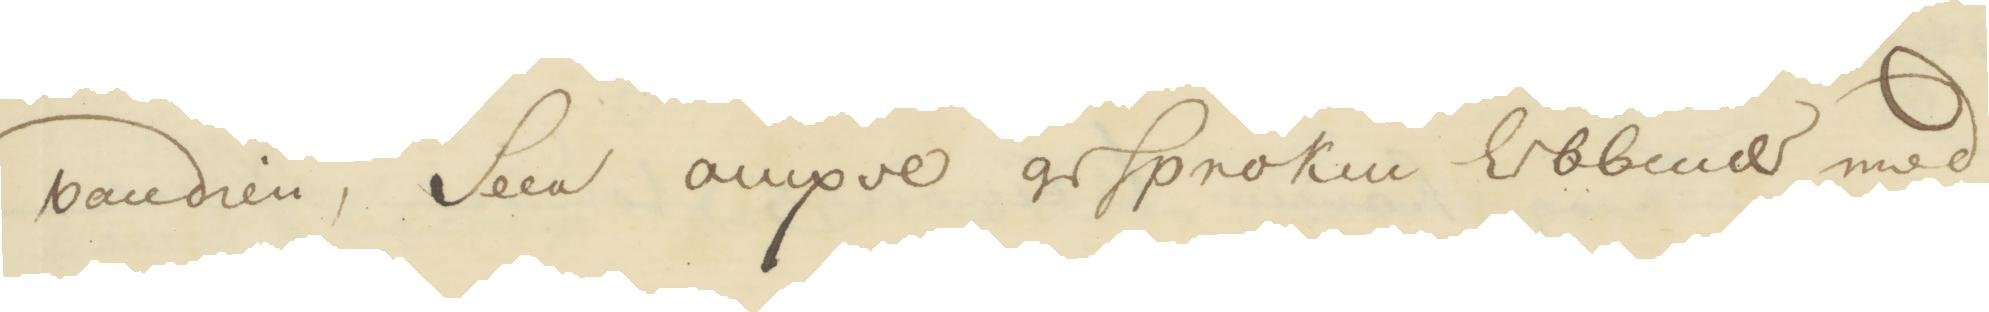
vandien, Seer ampel gesproken hebbende med
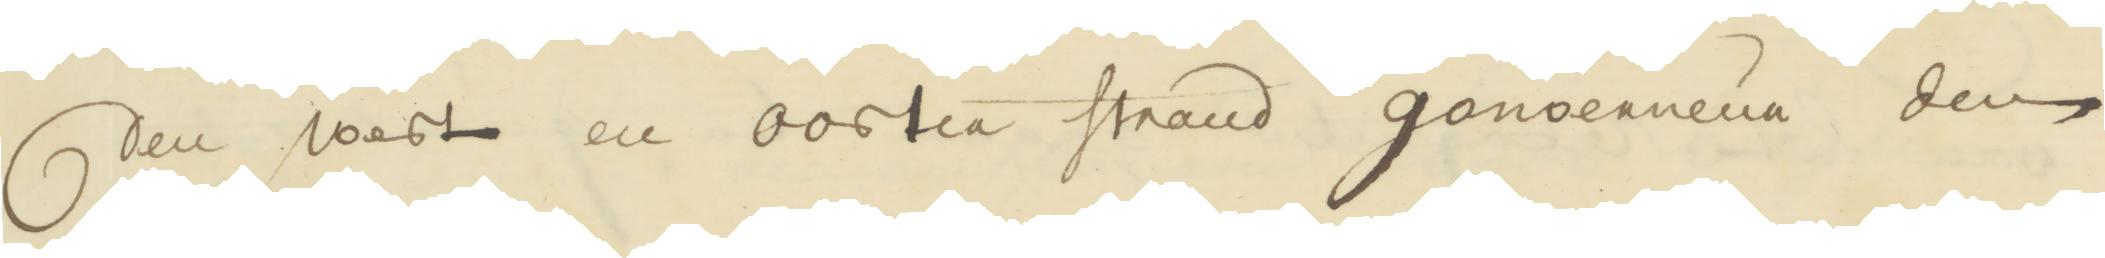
den west en ooster strand gouverneur den
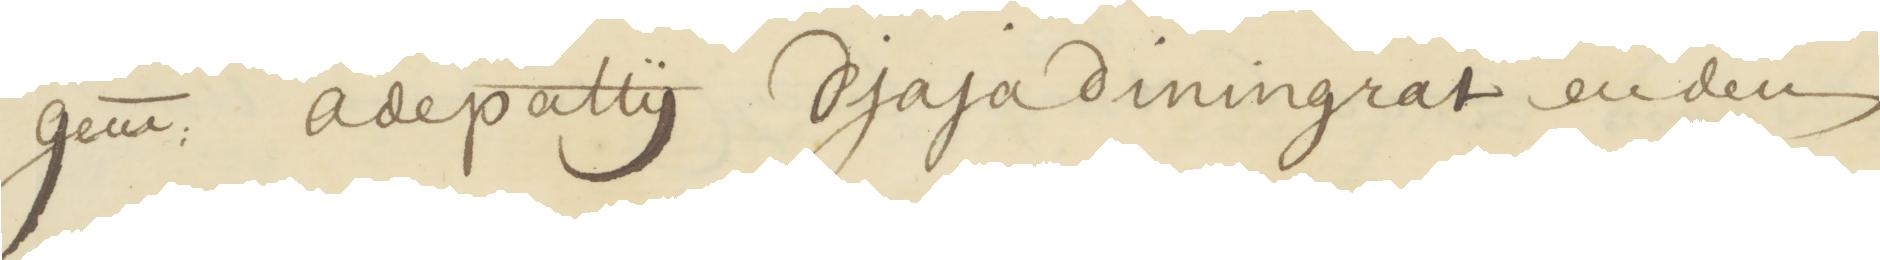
gem: adepattij djaja diningrat en den
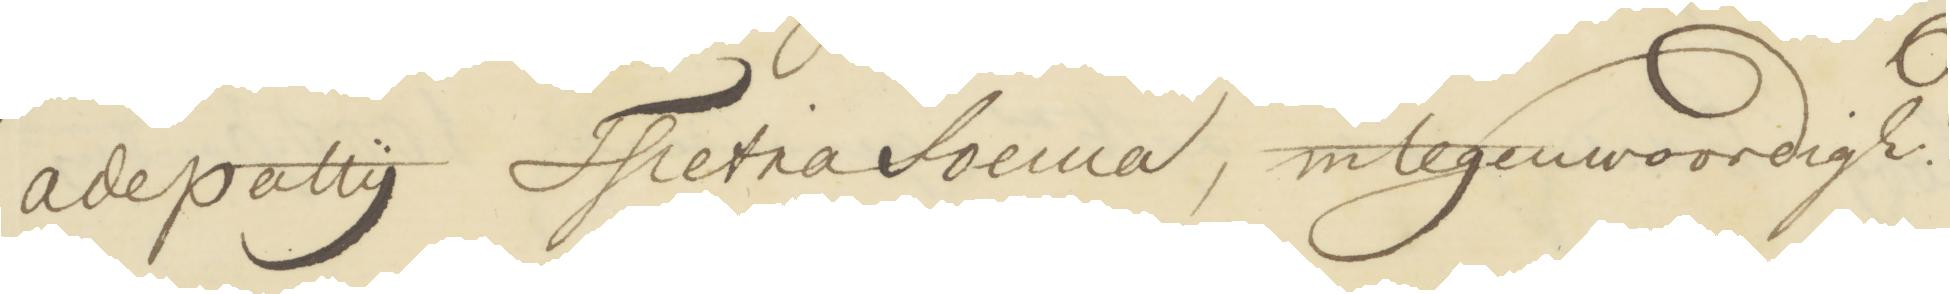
adepattij Tsietra Soema, integenwoordigh:d
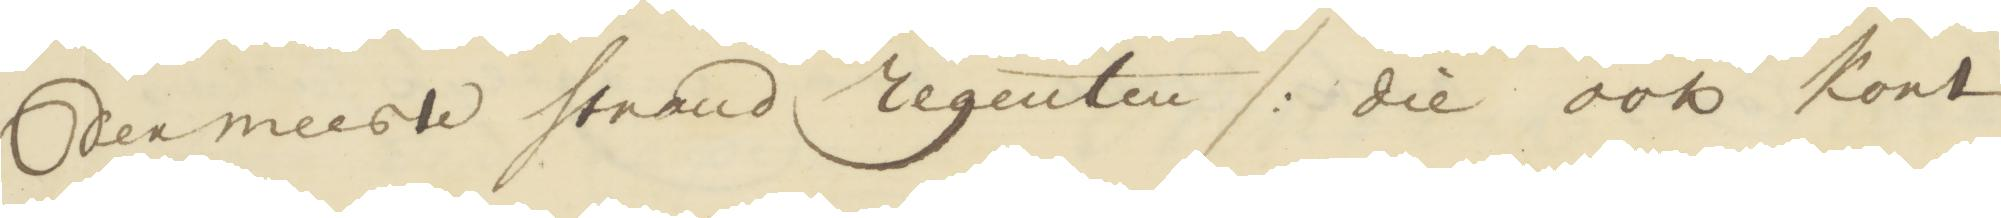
der meeste strand regenten /: die ook kort
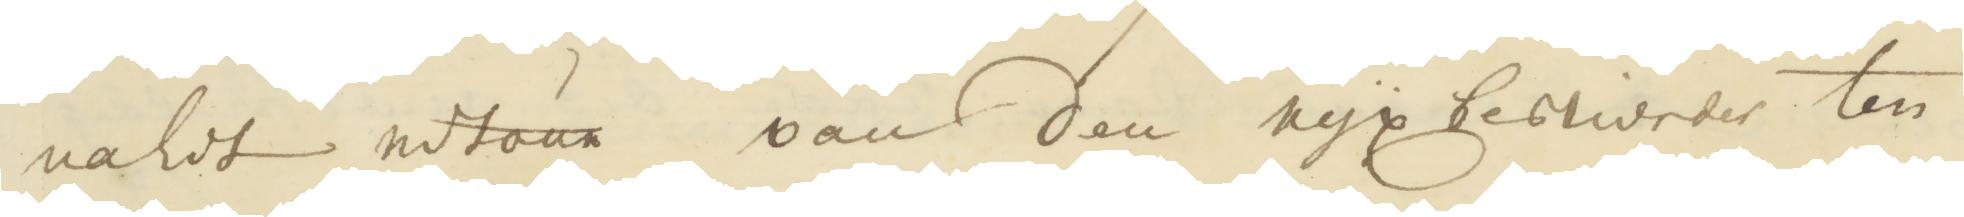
na het retour van den rijx bestierder ten
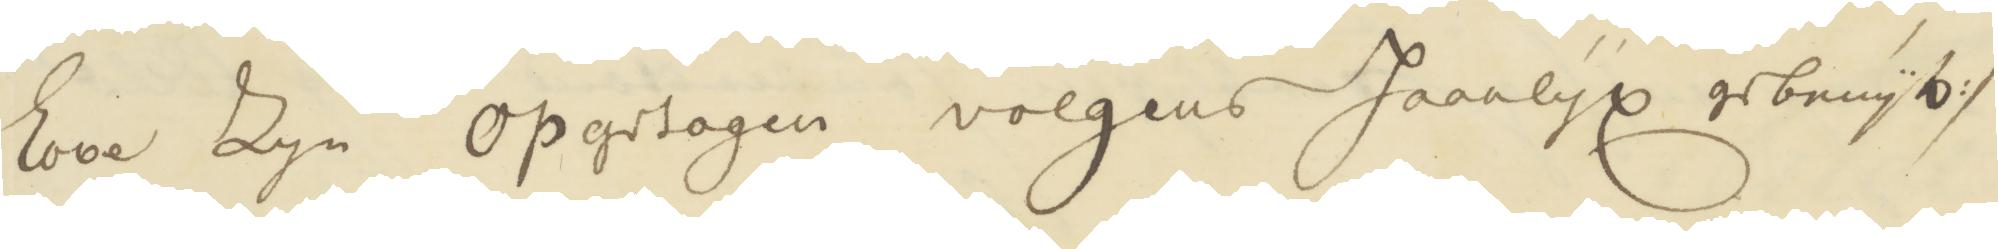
hove zijn opgetogen volgens Jaarlijx gebruijk:/
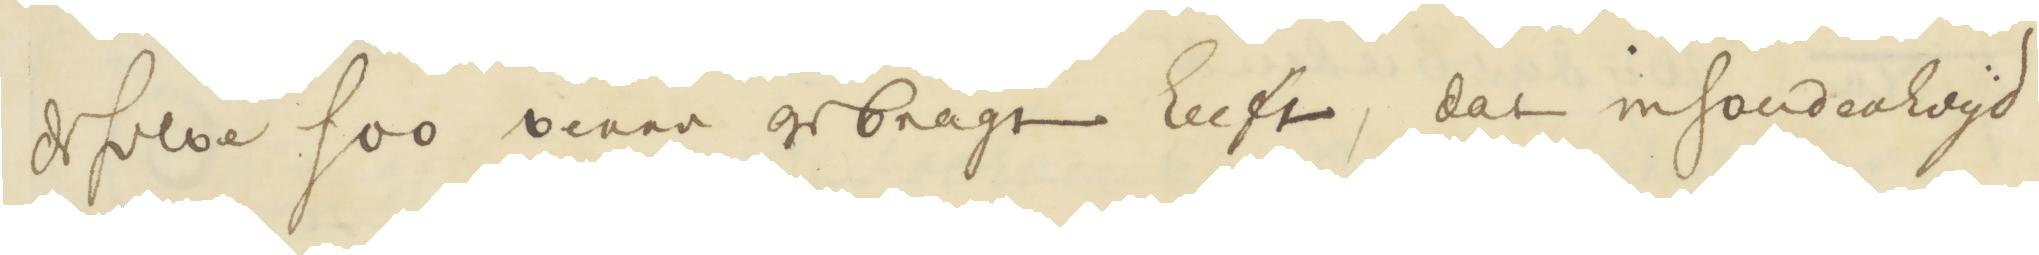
deselve soo verre gebragt heeft, dat insonderheijd
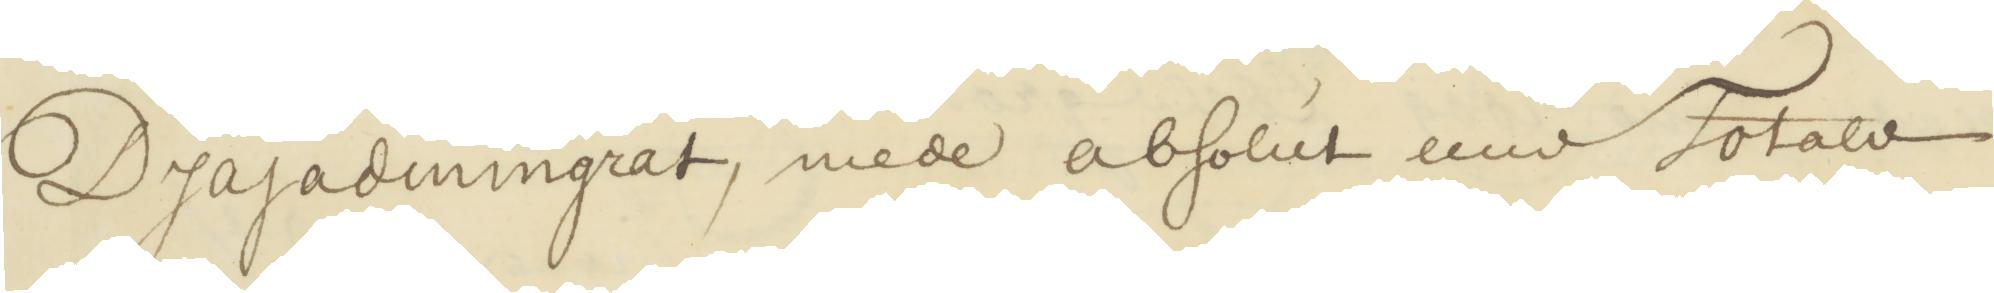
Djajadiningrat, mede absolut eene Totale
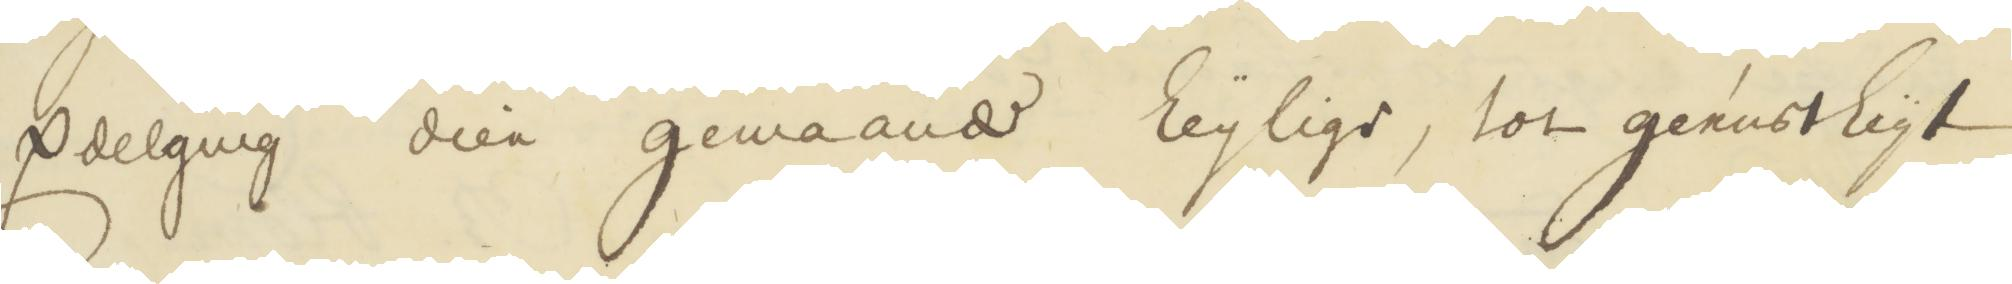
verdelging dier gewaande heijlige, tot gerustheijt
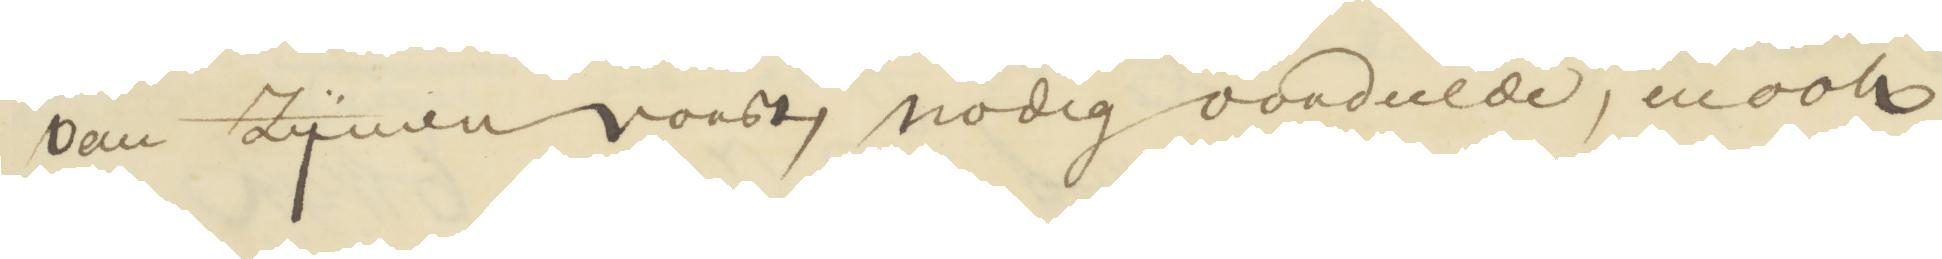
van zijnen vorst, nodig oordeelde, en ook
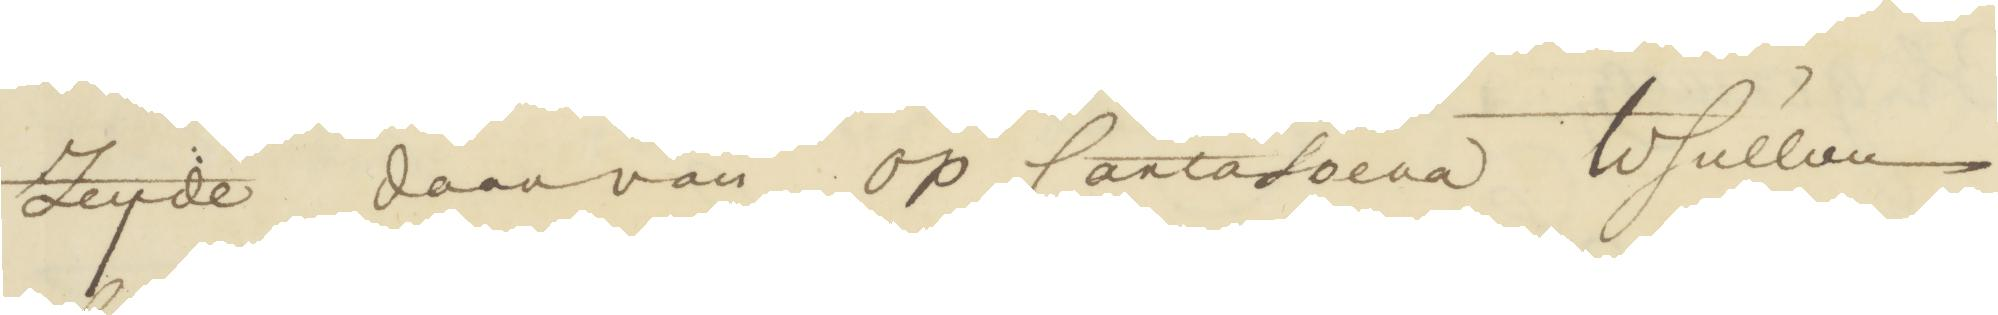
Zeijde daar van op Cartasoera tesullen
